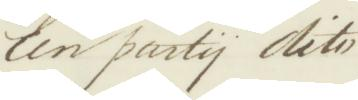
Een partij dito
